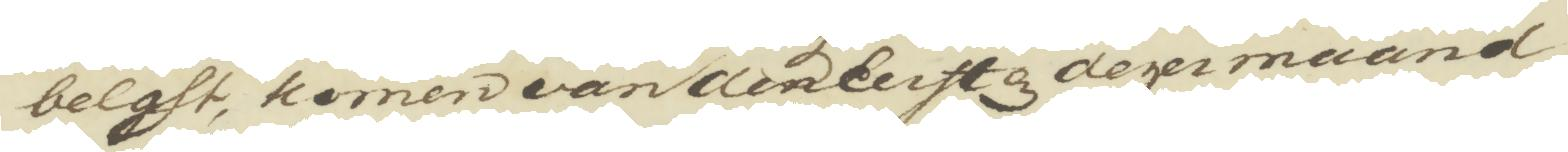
belast, komen van den Eersten dezer maand
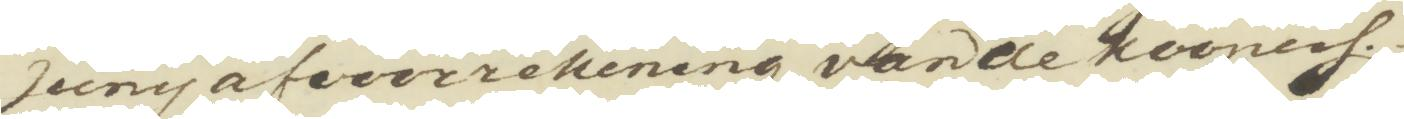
Juny af voorrekening van de koopers.
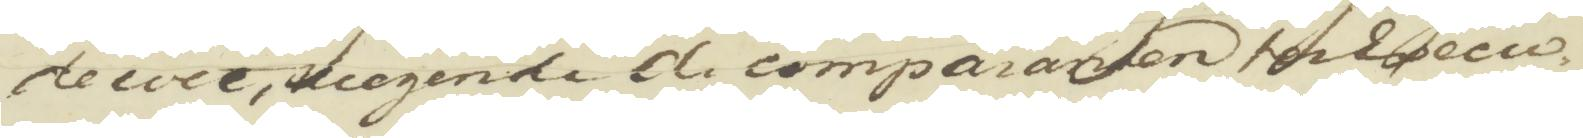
de wet, kiegende de comparanten ter Execu„
